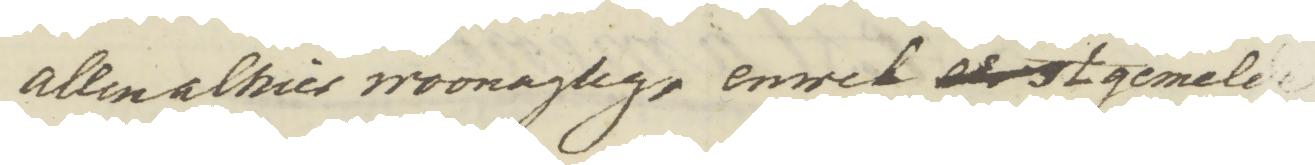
allen alhier woonagtig, en wel eerst gemeld.
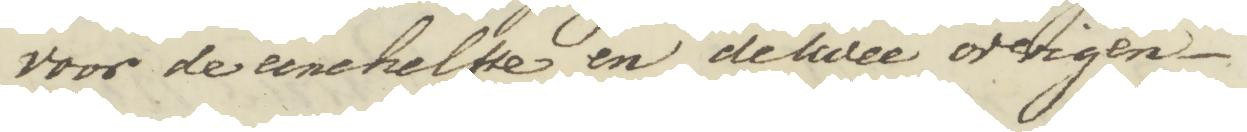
voor de eenehelfte en detwee overigen—
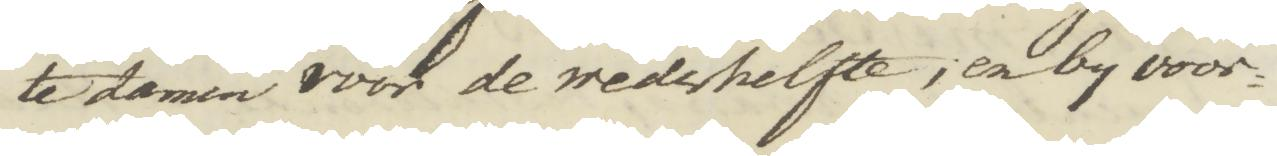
te zamen voor de wederhelfte, en by voor=
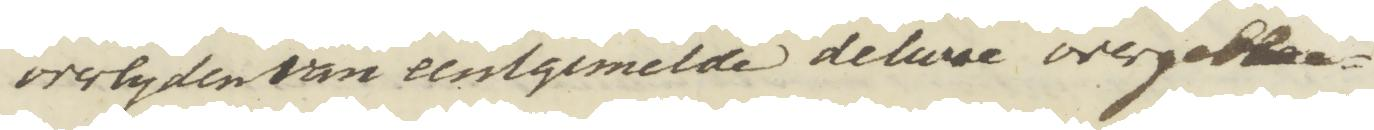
overlyden van eerstgemelde detwee overgeblee=
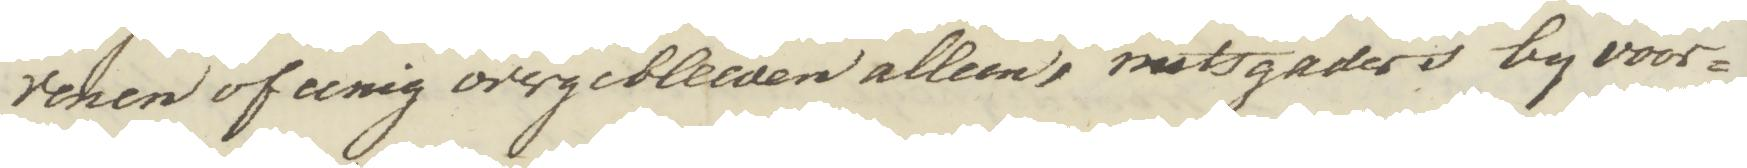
venen of eenig overgebleeven alleen, mitsgaders bij voor=
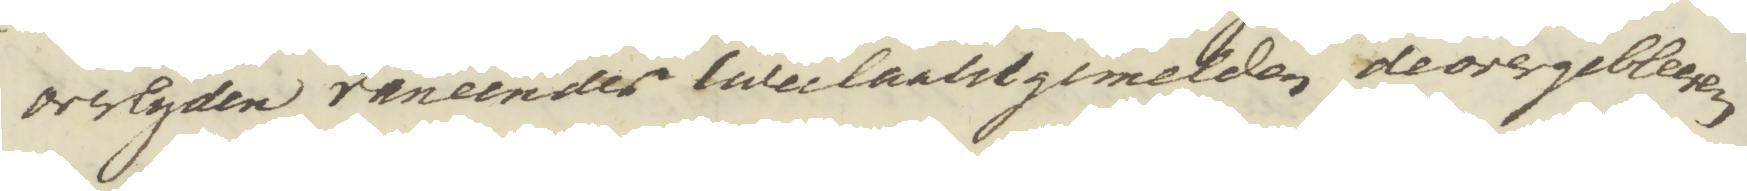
overlyden vaneender tweelaatstgemelden deovergebleeven
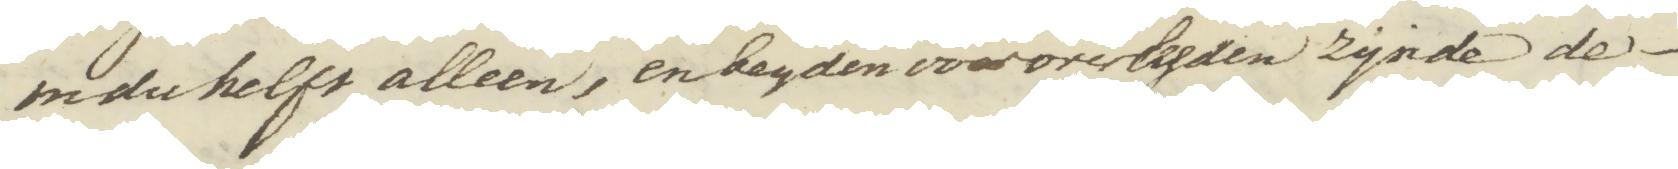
in die helft alleen, en beyden vooroverleeden zijnde de -
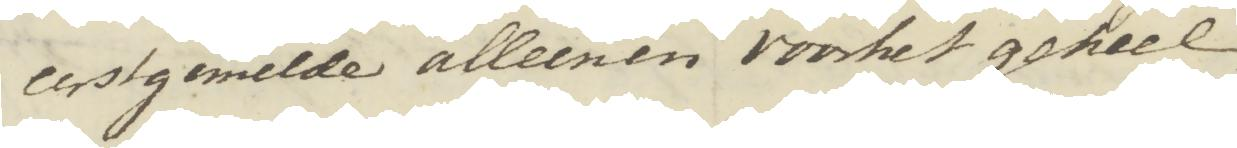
eerstgemelde alleenen voorhet geheel
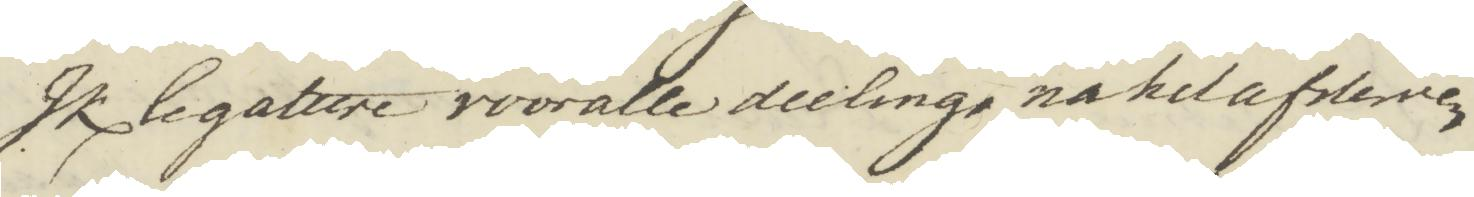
Ik legateere vooralle deeling, na het afsterven
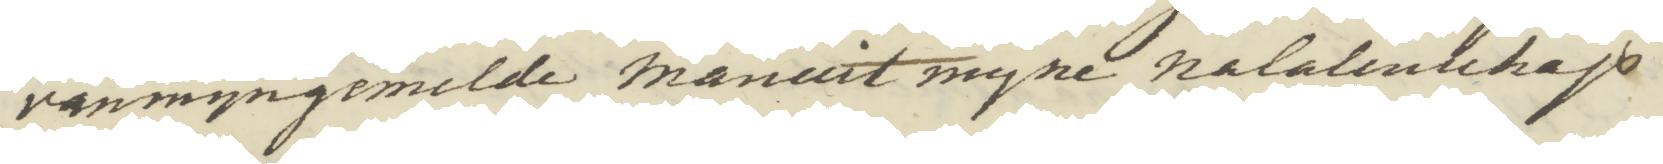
vanmyngemelde manuit myne nalatenschap
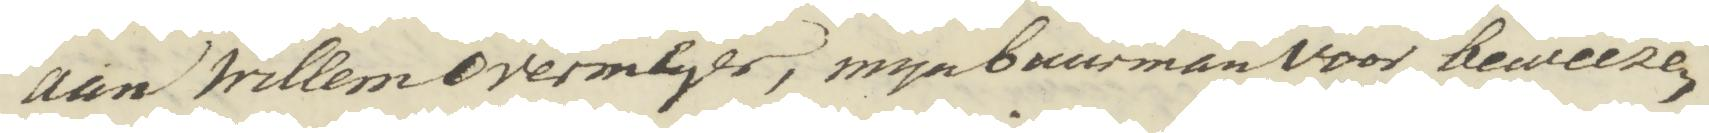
aan Willem Overmeijer, myn buurman voor beweezen
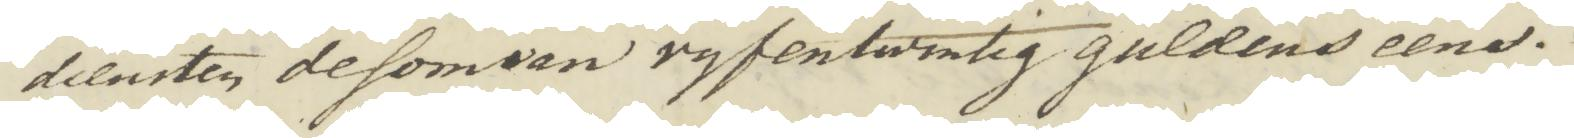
diensten desomvan vyfentwintig guldens eens.
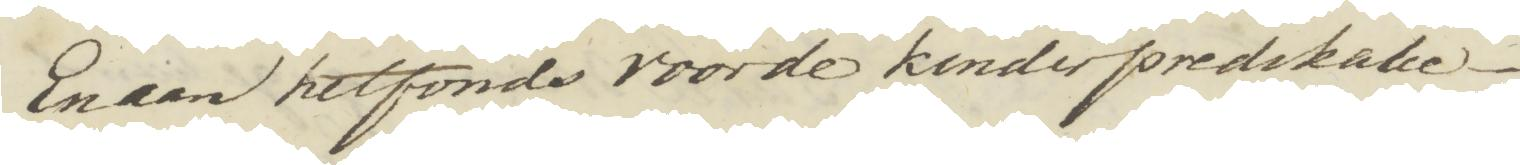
En aan hetfonds voorde kinderpredikatie
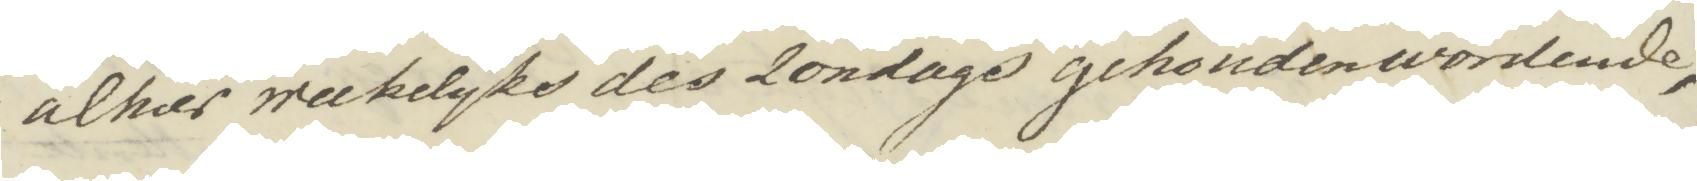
alhier weekelyks des zondags gehouden wordende,
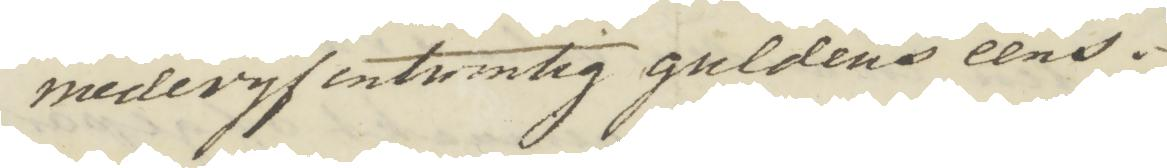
medevyf entwintig guldens eens.
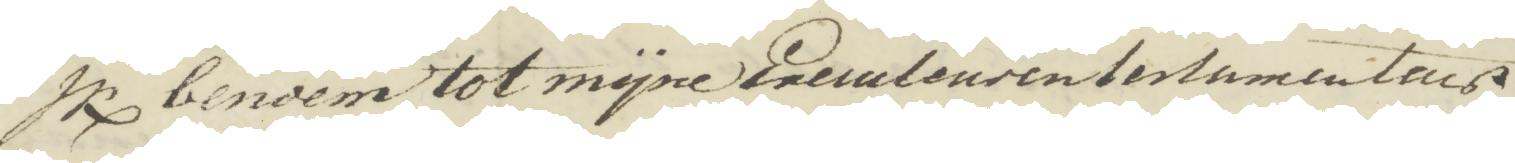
Ik benoem tot mijne Executeuren testamentair,
